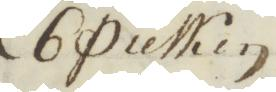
6 piekken
